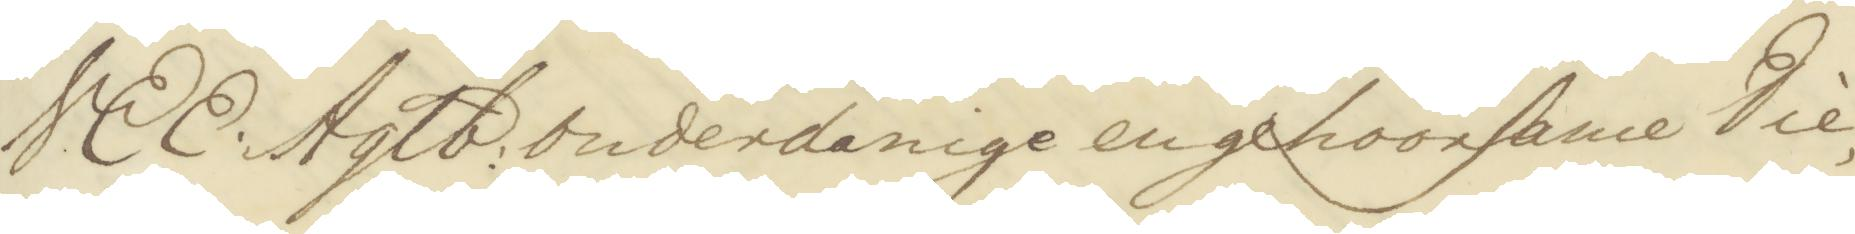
VEE: Agtb: onderdanige en gehoorsame die
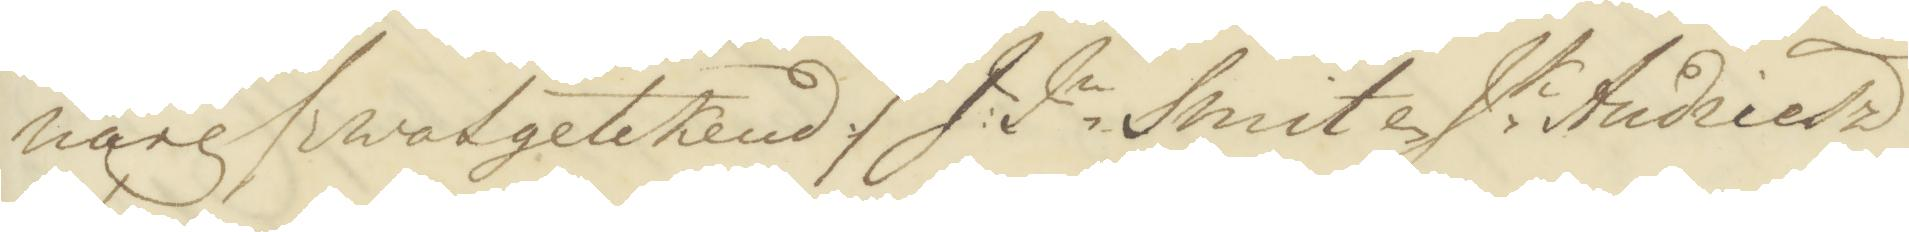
naren /:was getekend :/ J: I=n Smit en J=k Andriesz
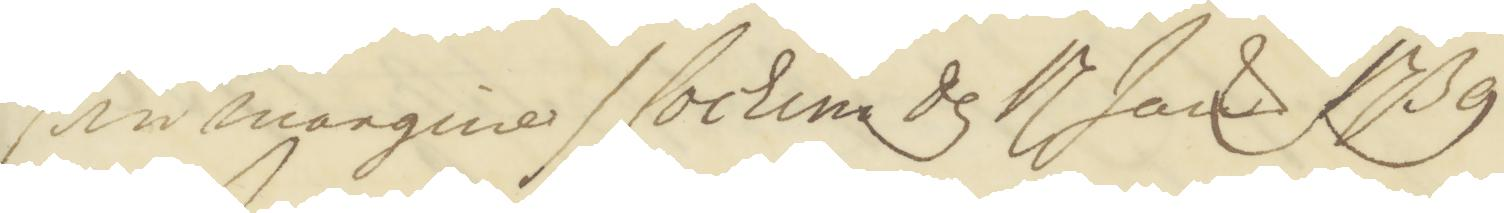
/.in margine / Cochim den 17 Jan 1739
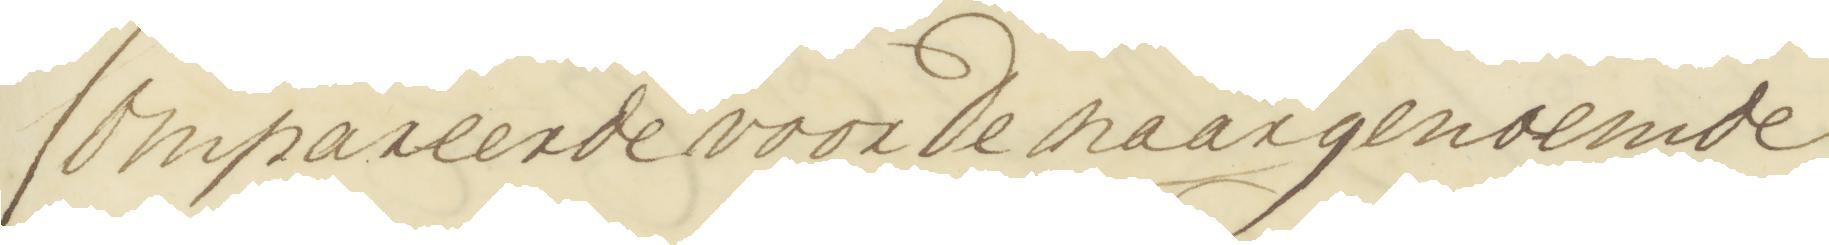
Compareerde voor de naar genoemde
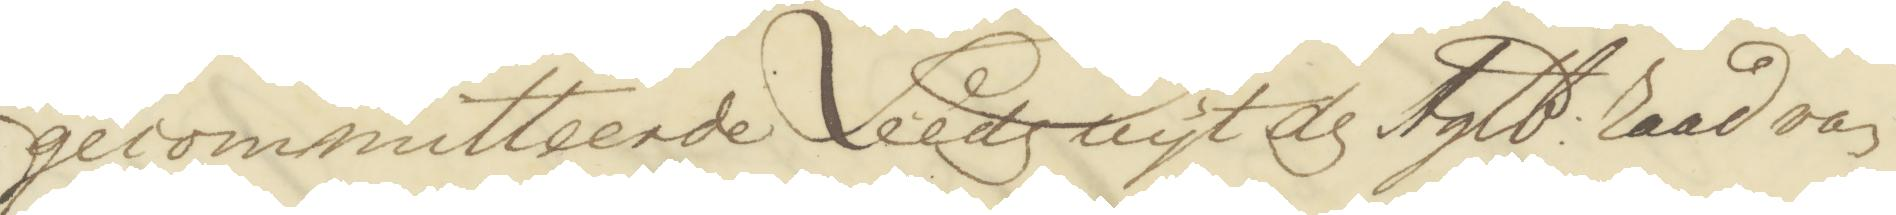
gecommitteerde Leeden uijt den Agtb: raad van
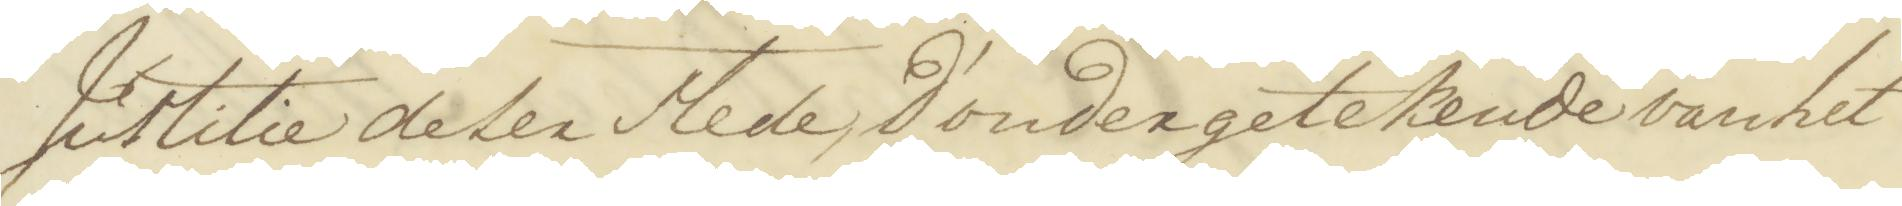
Justitie deser Mede, d’ondergetekende van het
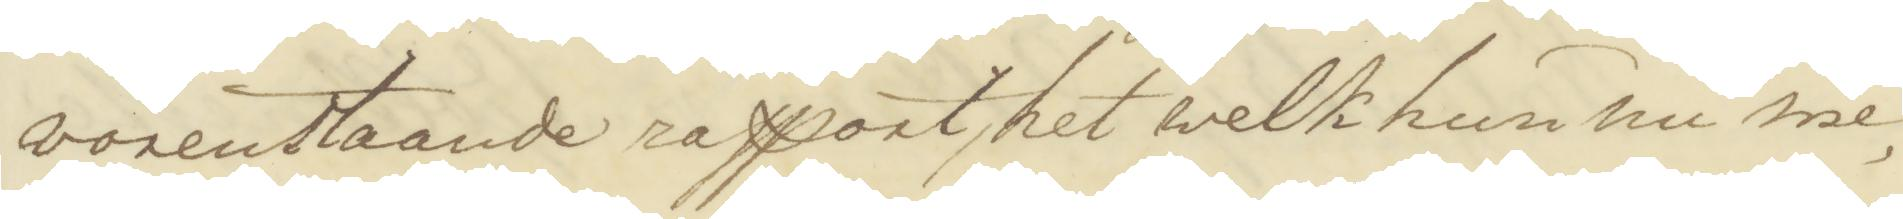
vorenstaande rapport, het welk hun nu we,
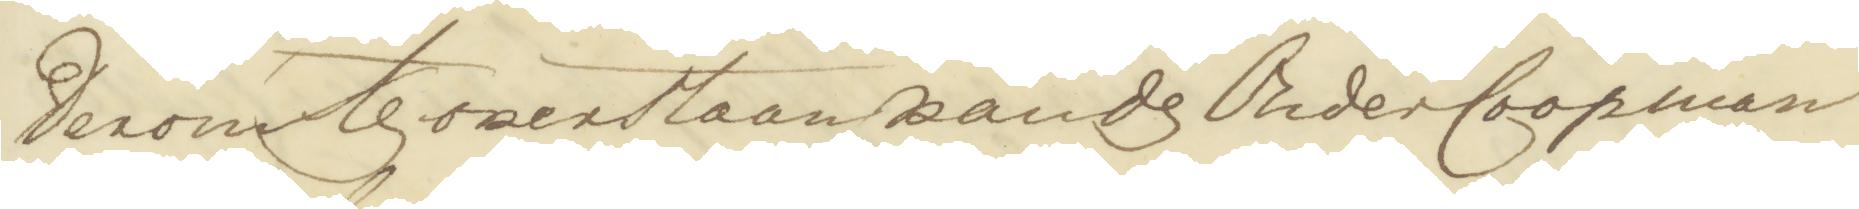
derom ten overstaan vanden Ondercoopman
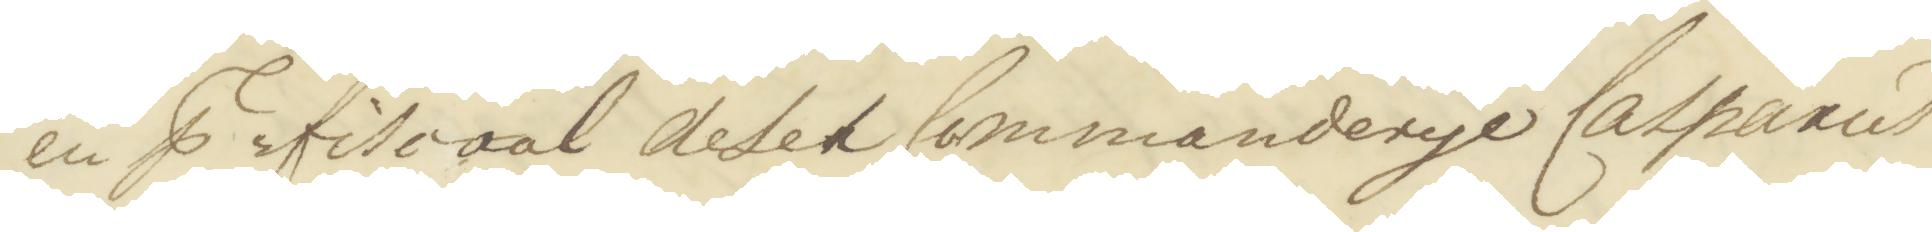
en pl fiscaal deser Commanderije Casparus
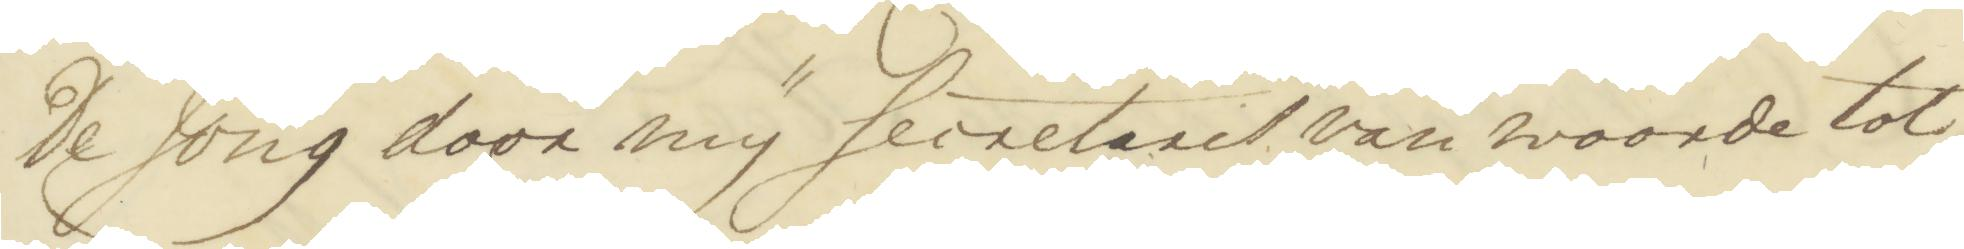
de Jong door mij secretaris van woorde tot
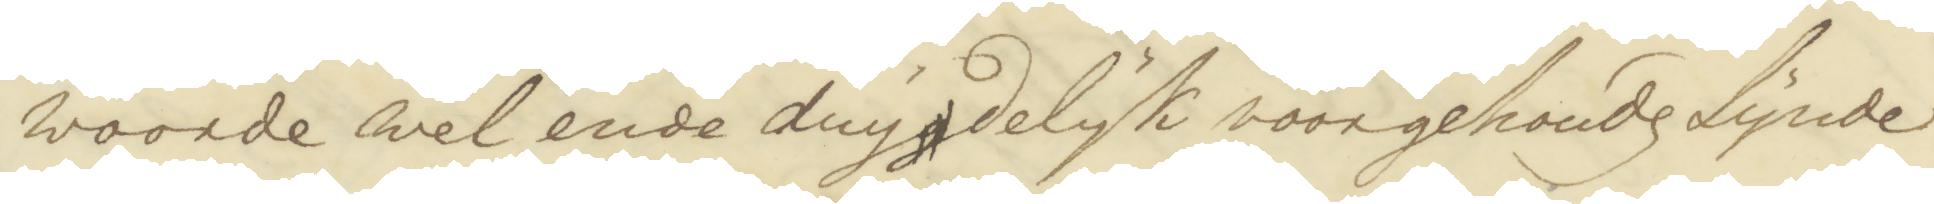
woorde wel ende duijgdelijk voorgehouden zijnde
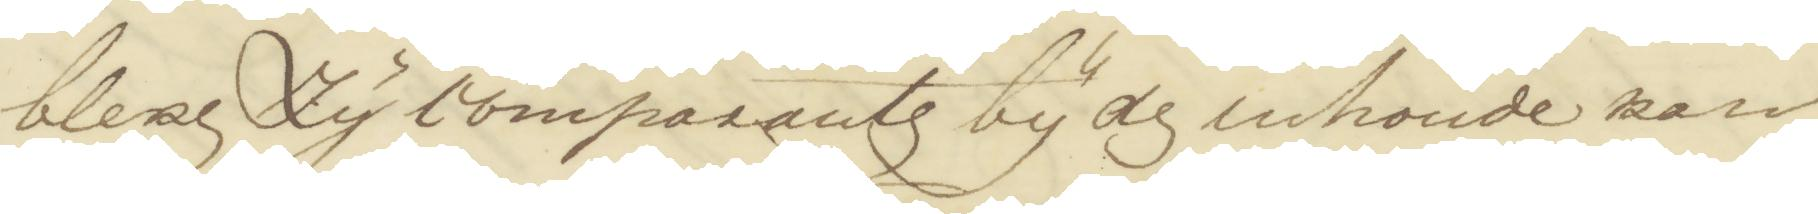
bleven zij comparanten bij den inhoude van
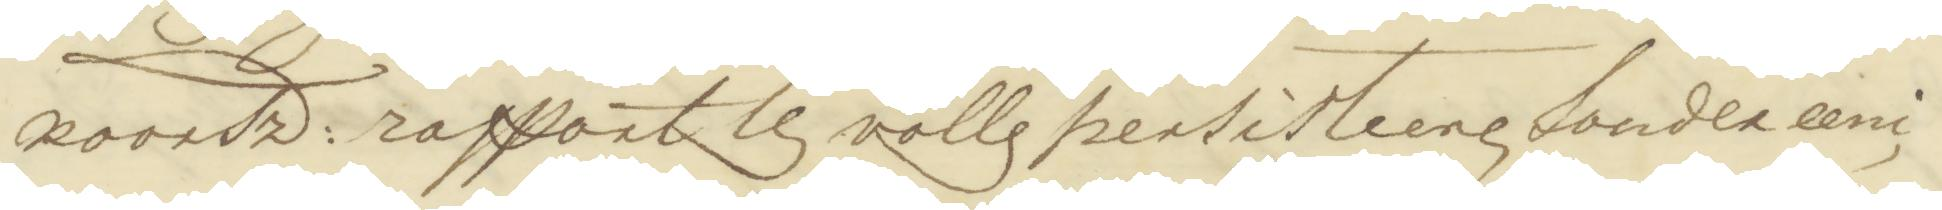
voorsz: rapport ten vollen persisteeren sonder eeni,
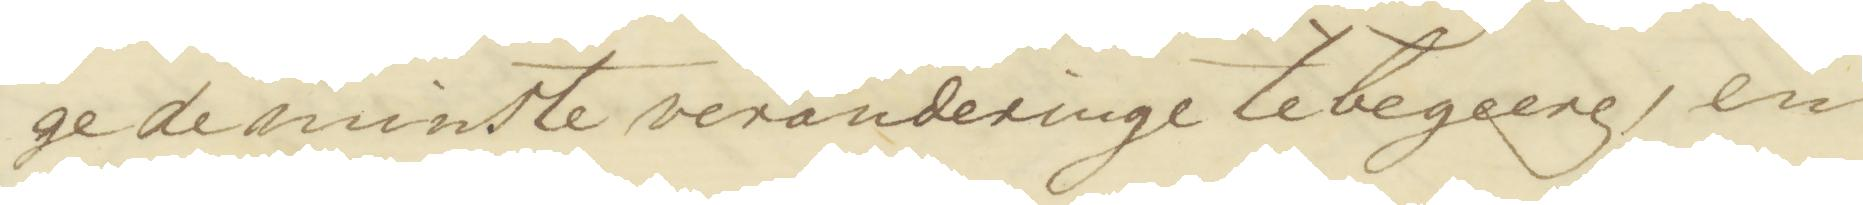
ge de minste veranderinge te begeeren, en
